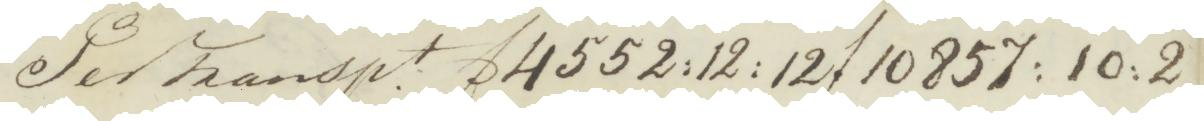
Per Transp.t ƒ4552:12:12ƒ10857: 10:2
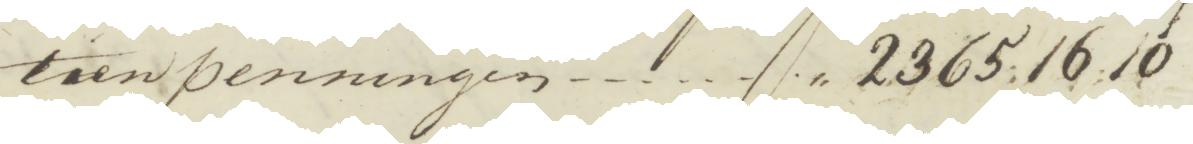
tien penningen - - - - - - - „ 2365:16:10
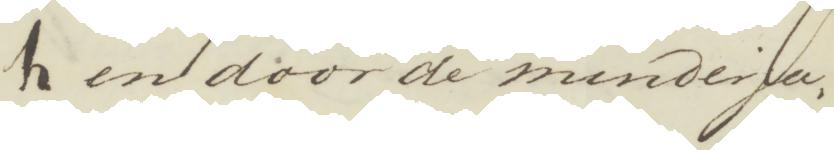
h en door de minderja„
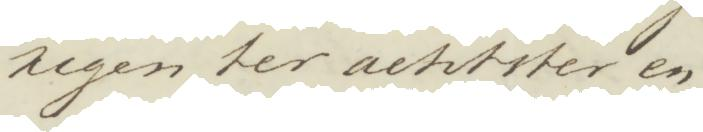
rigen ter achtster en
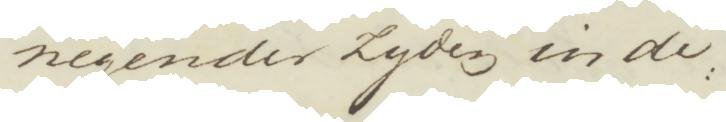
negender zyden in de:
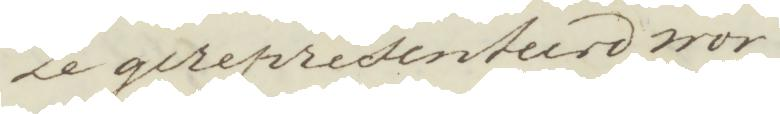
ze gerepresenteerd wor:
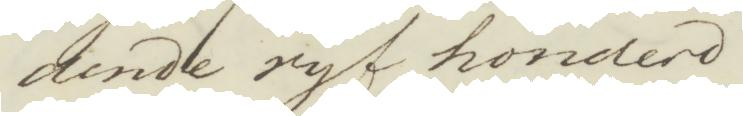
dende vyf honderd
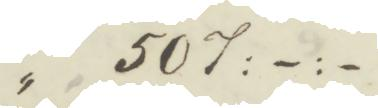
„ 507: —:—
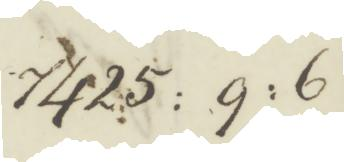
7425: 9 : 6
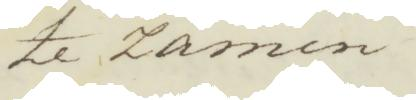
te zamen
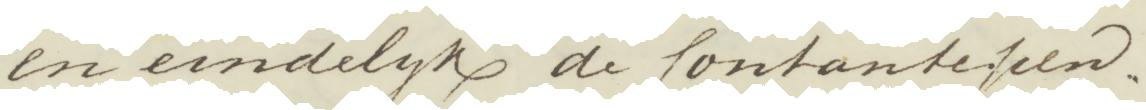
en eindelyk de Contante pen„
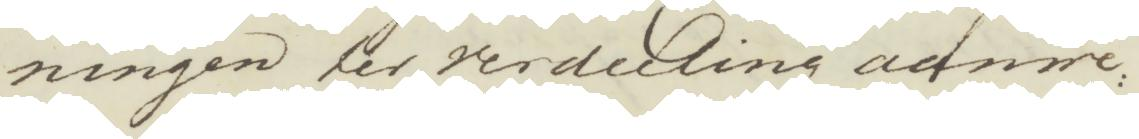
ningen ter verdeeling aanwe:
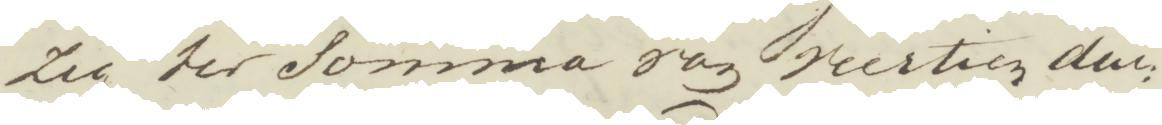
zig ter somma van Veertien dui:
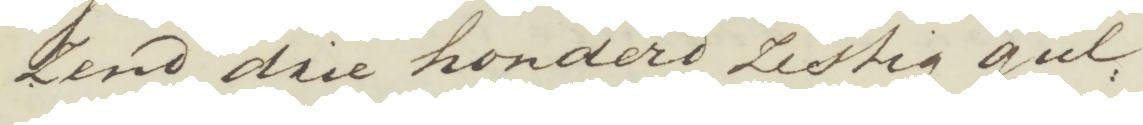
zend drie honderd zestig gul:
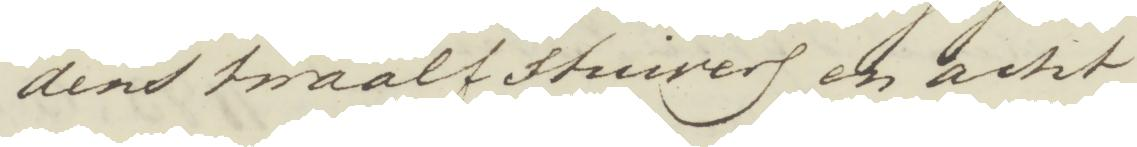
dens twaalf stuivers en acht
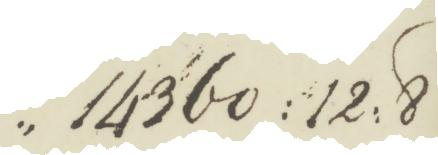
„ 14360 :12: 8
